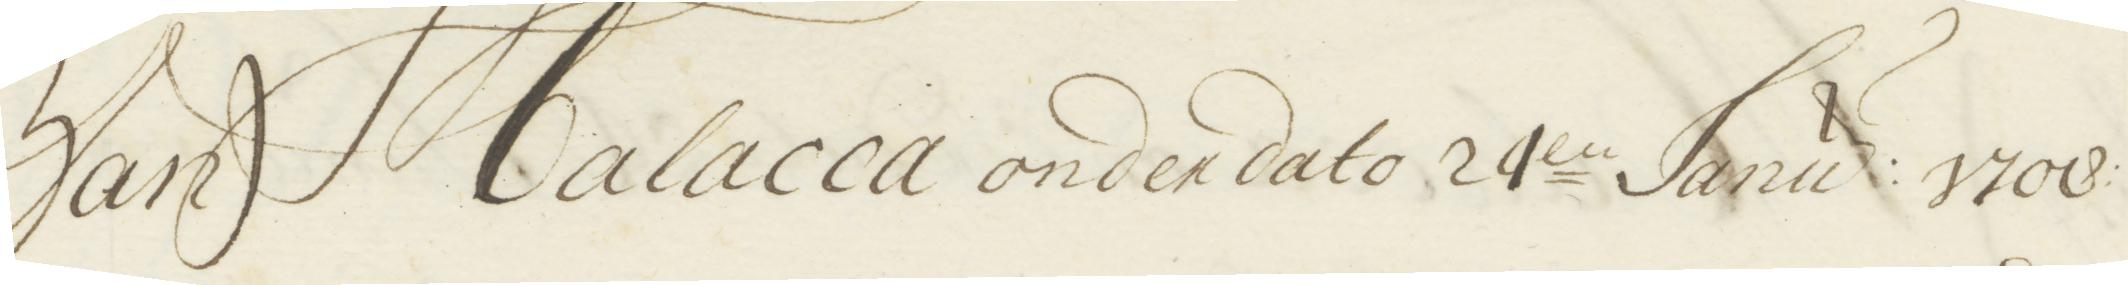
Van Malacca onder dato 24=en Janu: 1708:
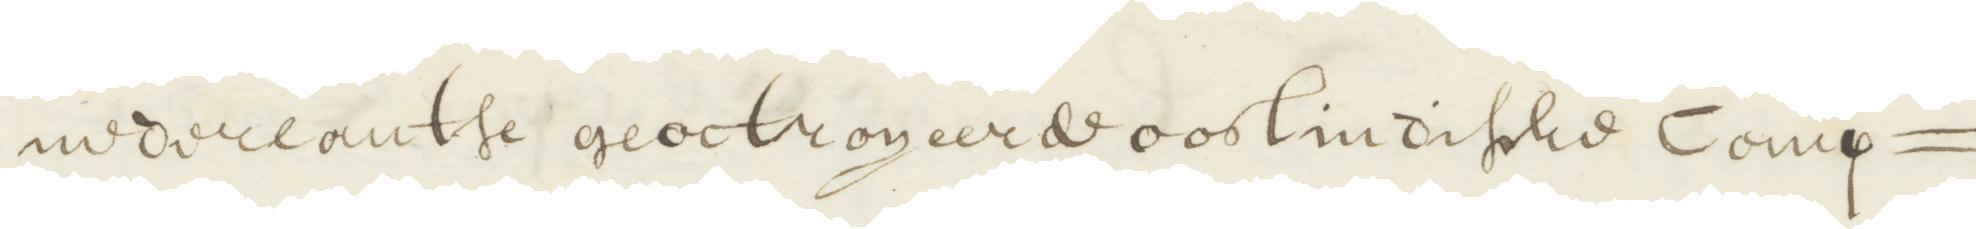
nederlantse geoctroyeerde oostindische Comp=e
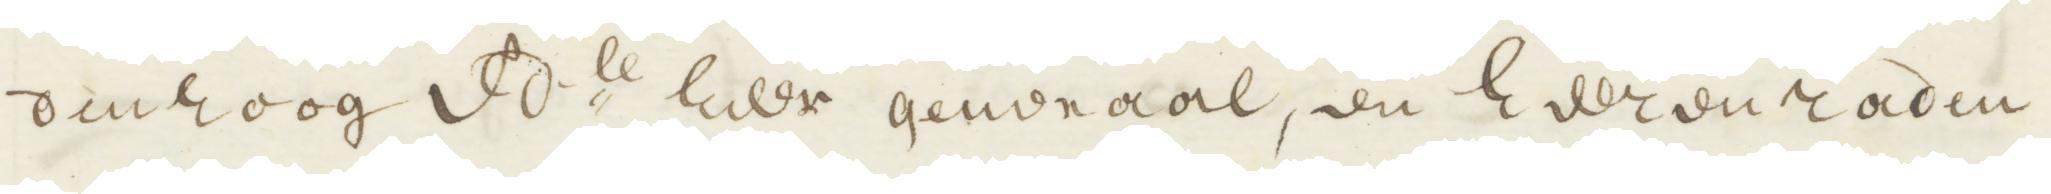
den hoog Ed„le heer generaal, en heeren raden
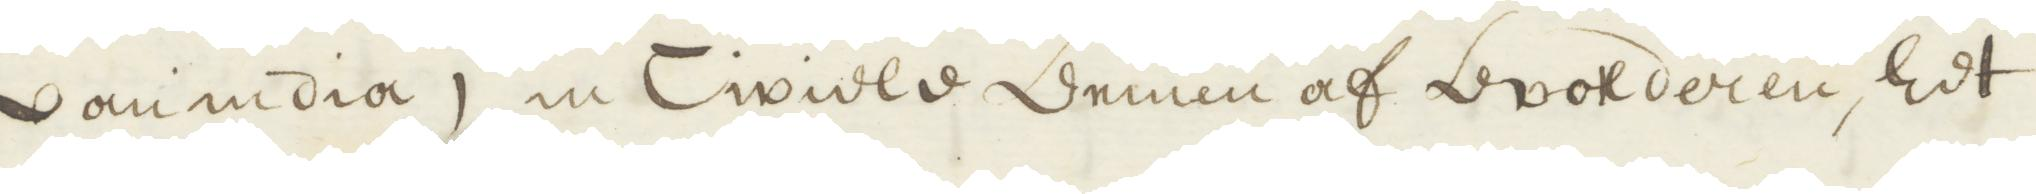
van india, in Civiele termen af te vorderen, het
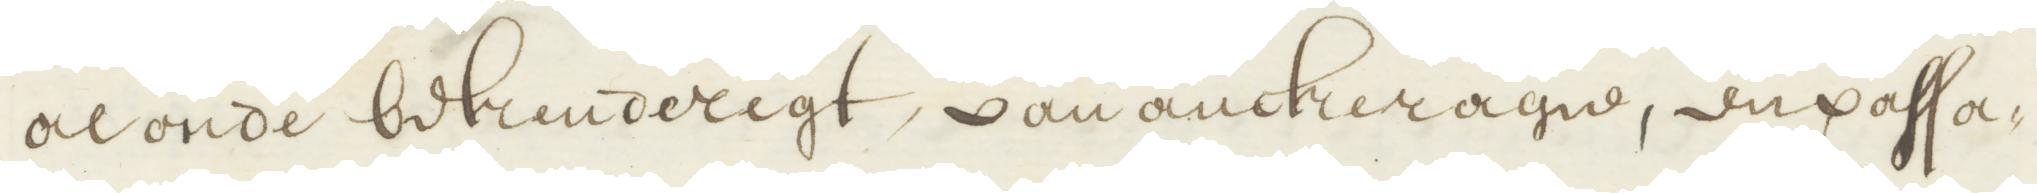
al oude bekenderegt, van anckeragie, en passa„
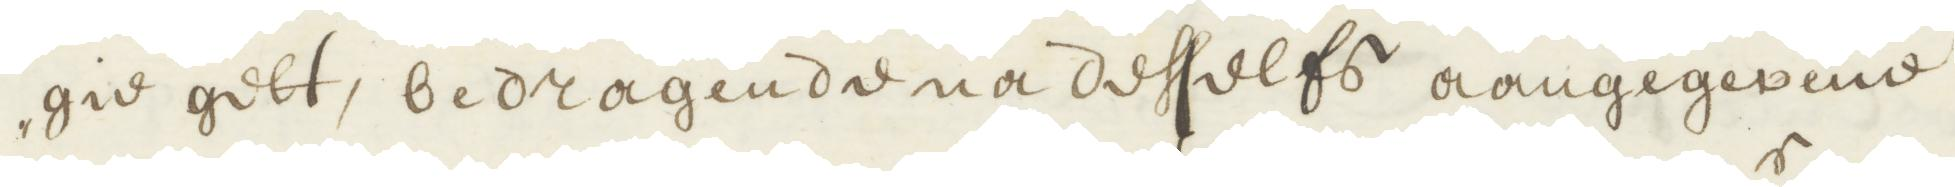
„gie gelt, bedragende na desselfs aangegevene
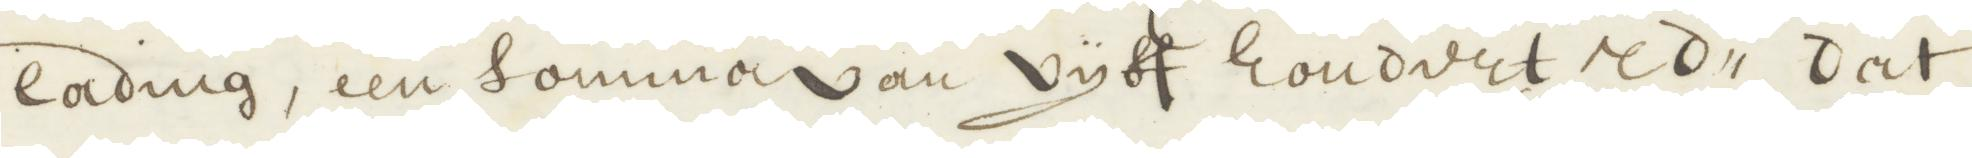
lading, een somma van vijff hondert rd„s dat
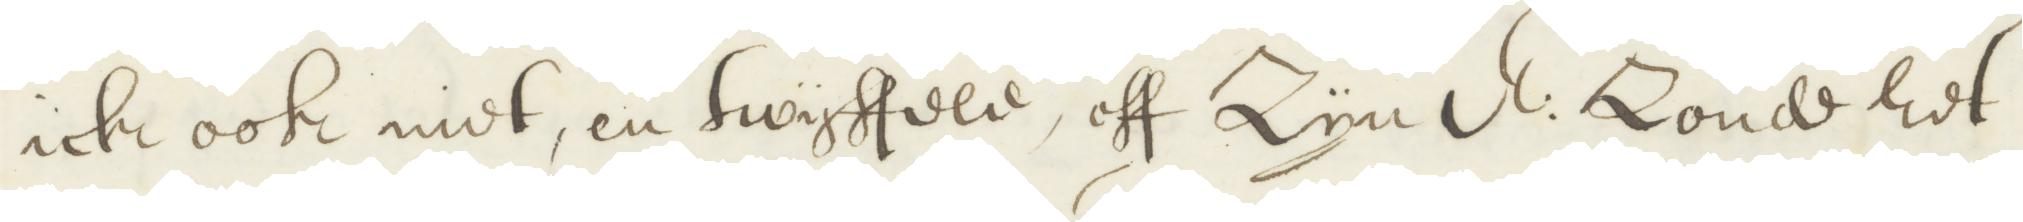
ick ook niet, en twijffele, off zijn E: zoude het
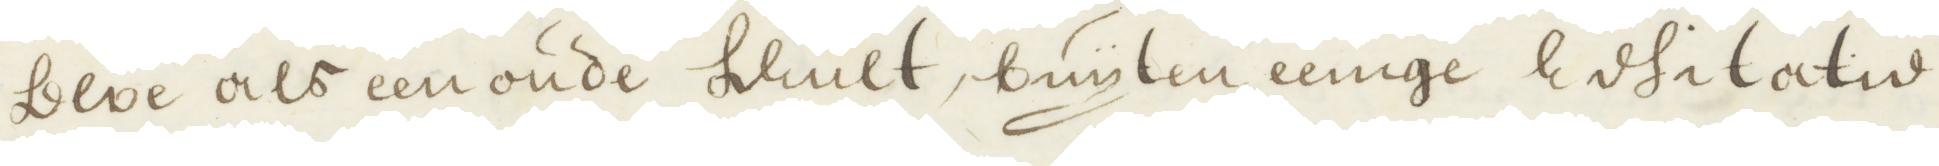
selve als een oude schult, buijten eenige hesitatie
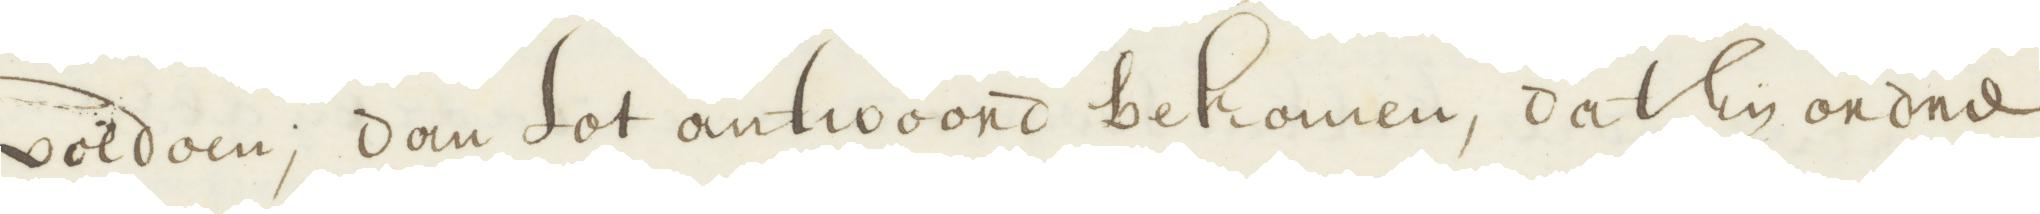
voldoen; dan tot antwoord bekomen, dat hij ordre
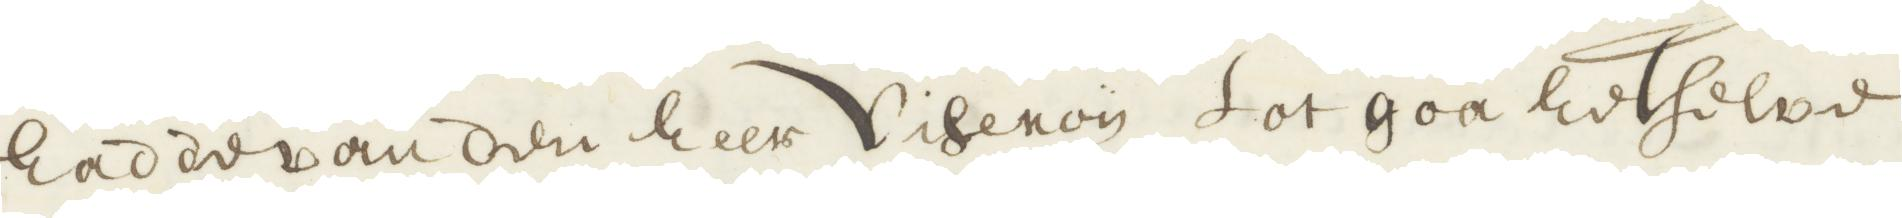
hadde van den heer Viseroij tot goa hetselve
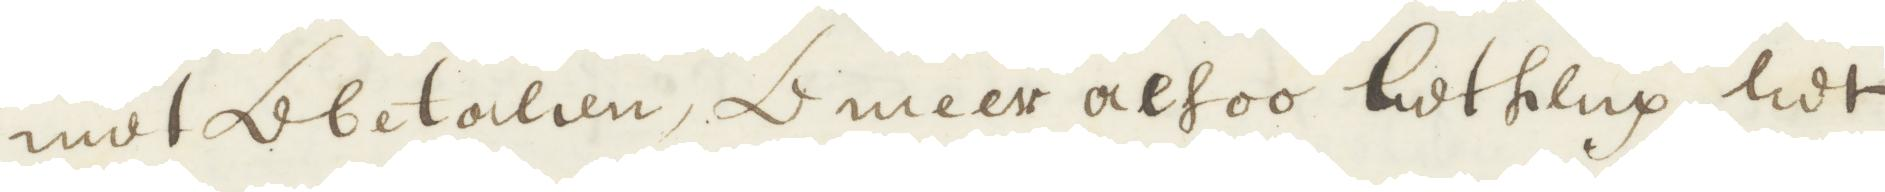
niet te betalen, te meer alsoo het schip, het
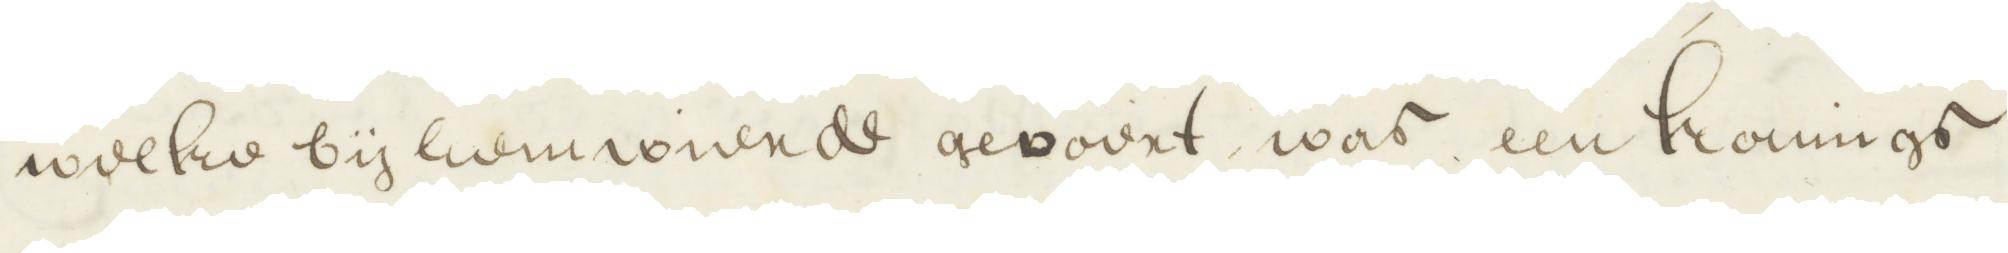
welke bij hem wierde gevoert, was een konings
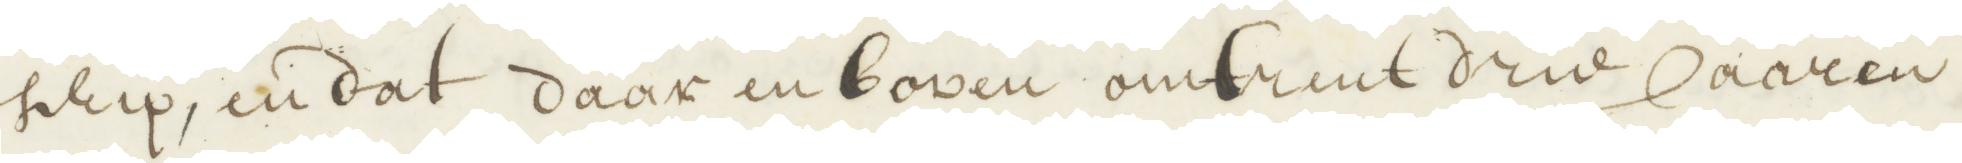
schip, en dat daar en boven omtrent drie Jaaren
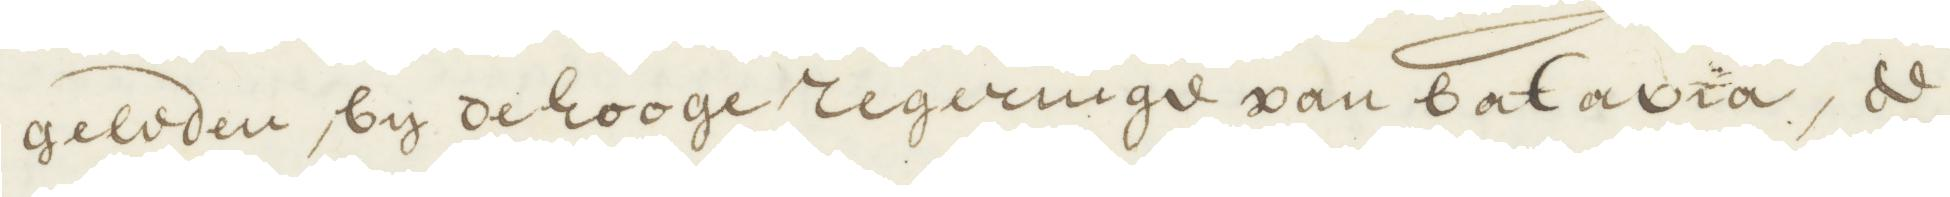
geleden, bij de hooge regeringe van batavia, de
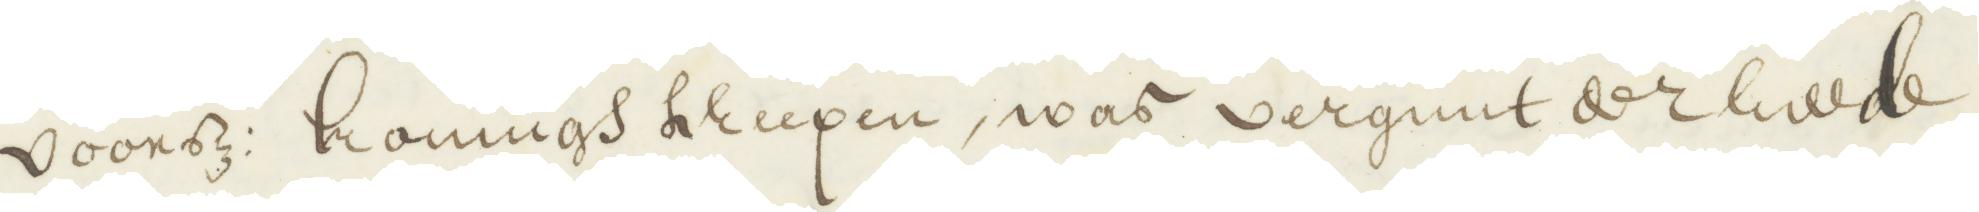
voors: konings scheepen, was vergunt de rheede
